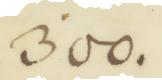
300.
